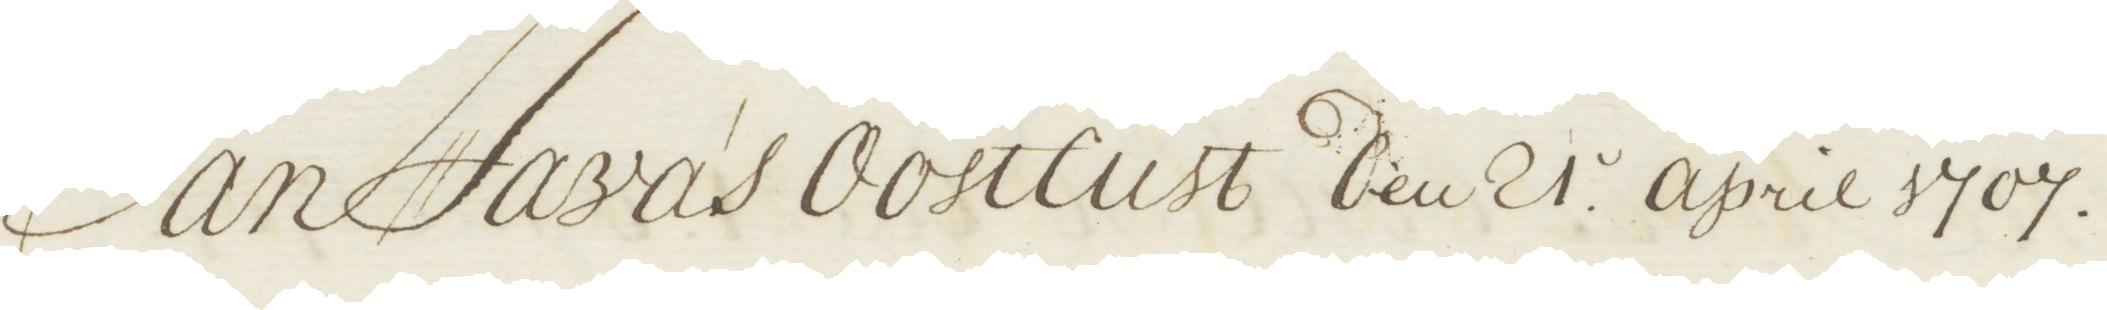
Van Java's Oostcust den 21:e april 1707.
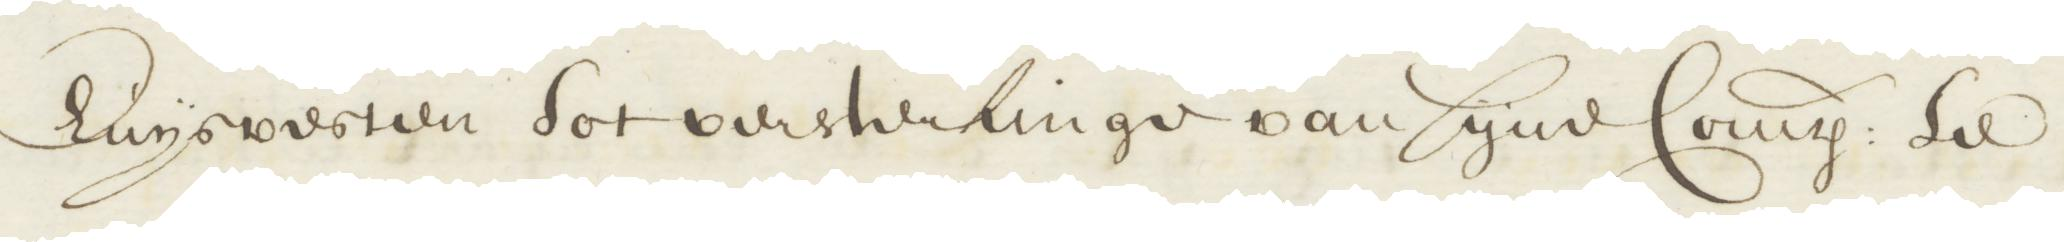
huijsvesten tot versterkinge van sijne Comp: te
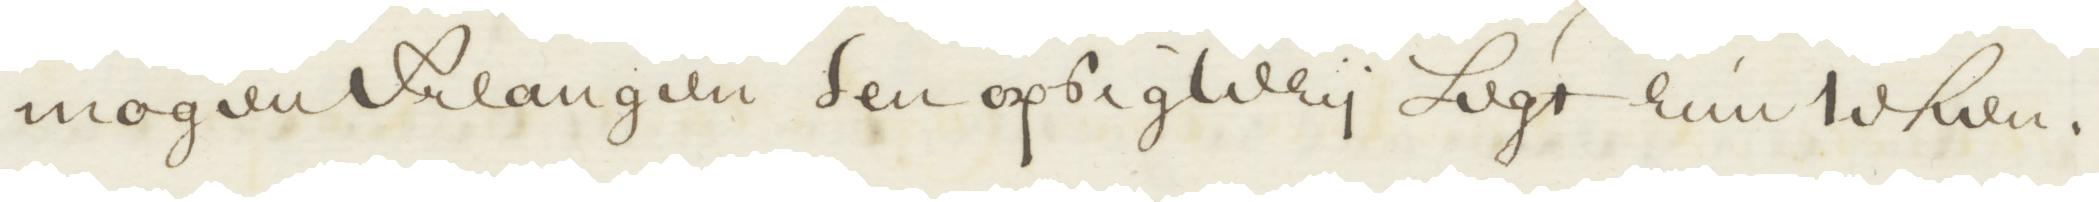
mogen Erlangen ten opsigte hij segt hun te ken„
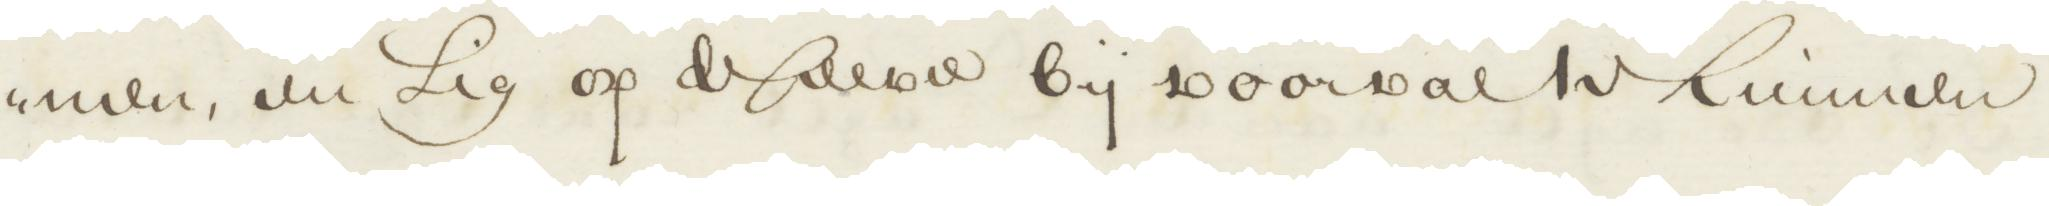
nen, en sig op deselve bij voorval te kunnen
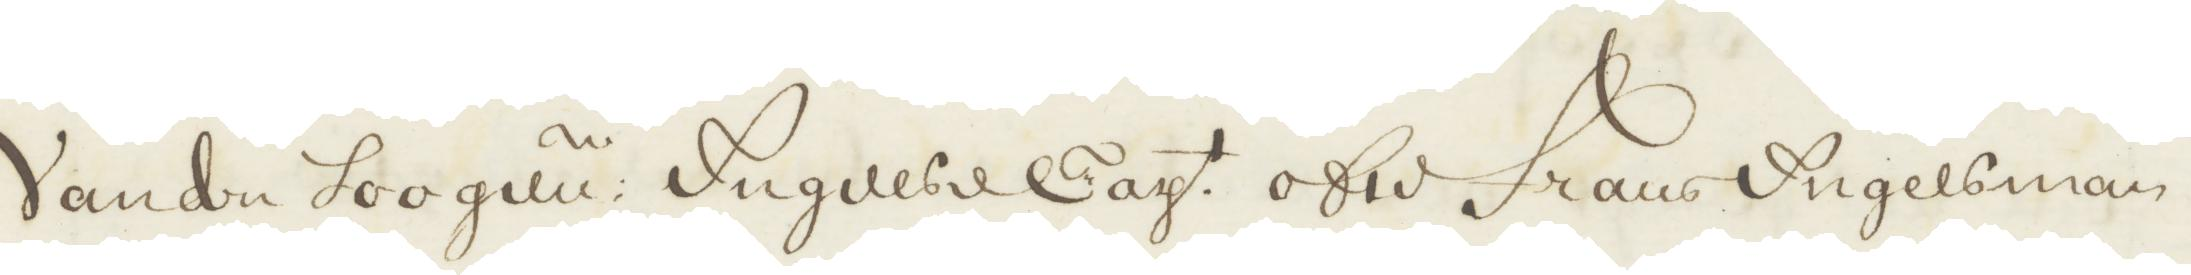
Van den soo gen: Engelse Cap.t ofte Frans Engelsman
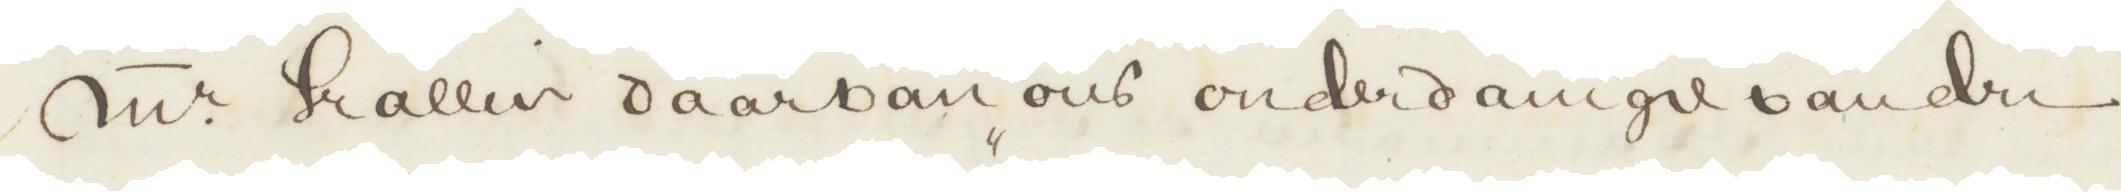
m.r kallin daarvan„ ons onderdanige van den
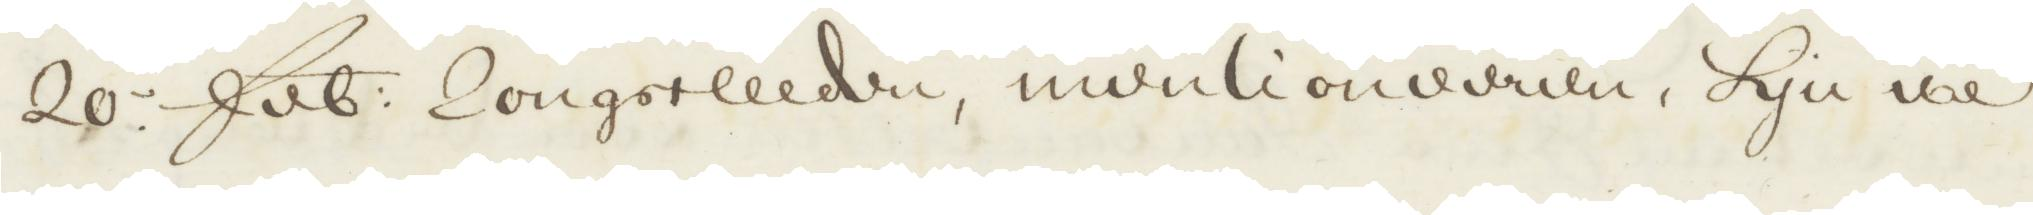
20.e feb: jongstleeden, mentioneeren, sijn we
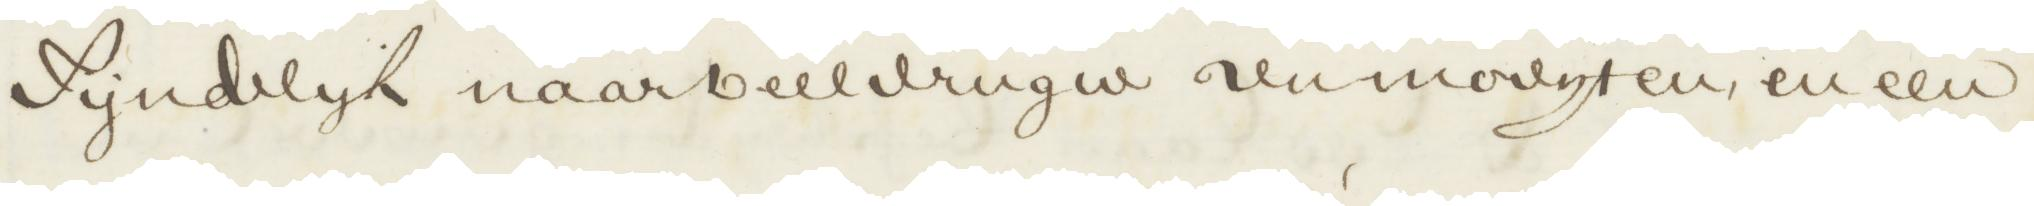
Eijndelijk naar veel erugie en moeyten, en een
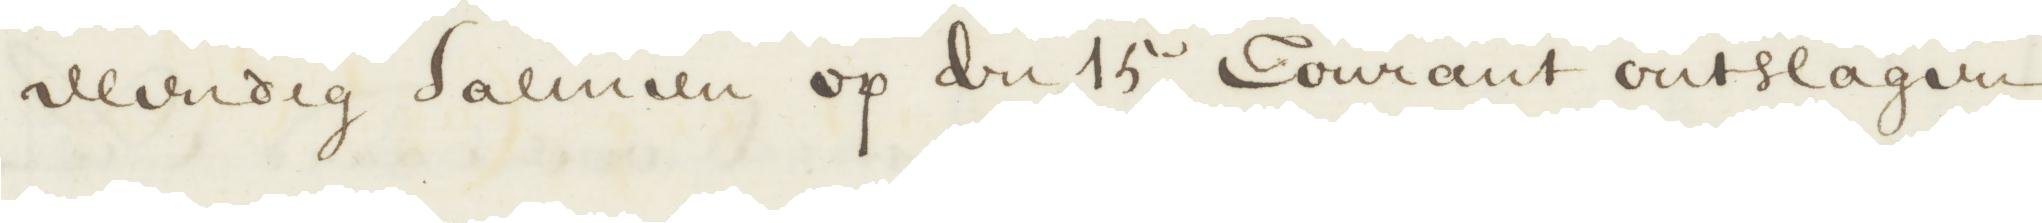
elendig talmen op den 15.e Courant ontslagen
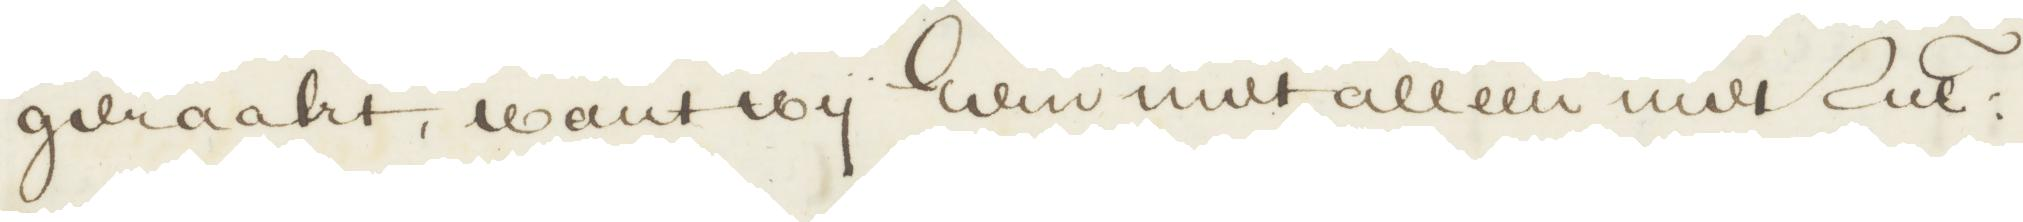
geraakt, want wij hem niet alleen met Iul:
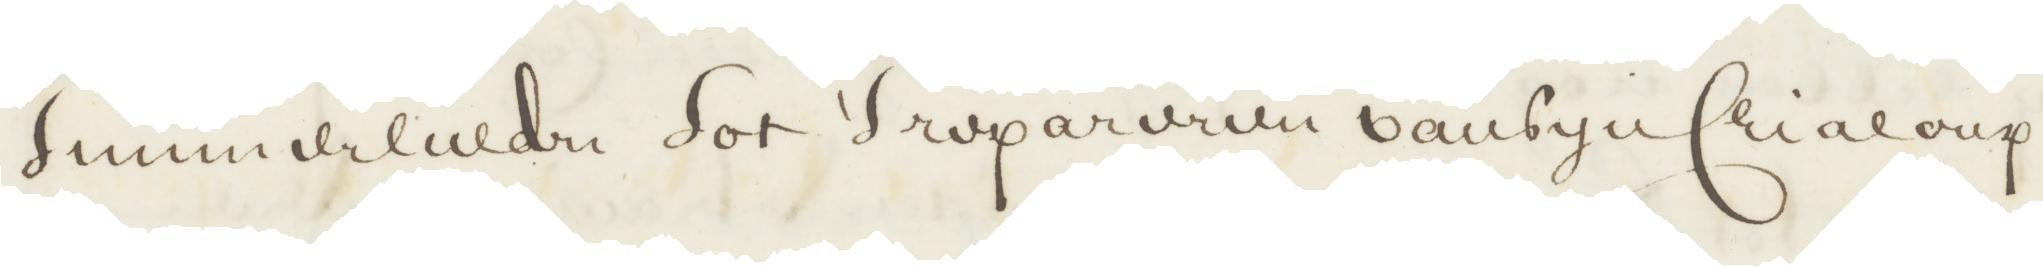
timmerlieden tot 't repareren van sijn Chialoup
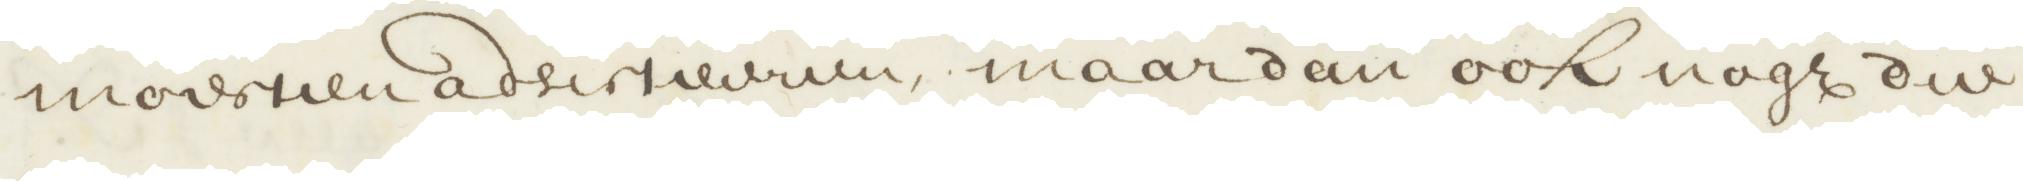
moesten adsisteeren, maar dan ook nogh die
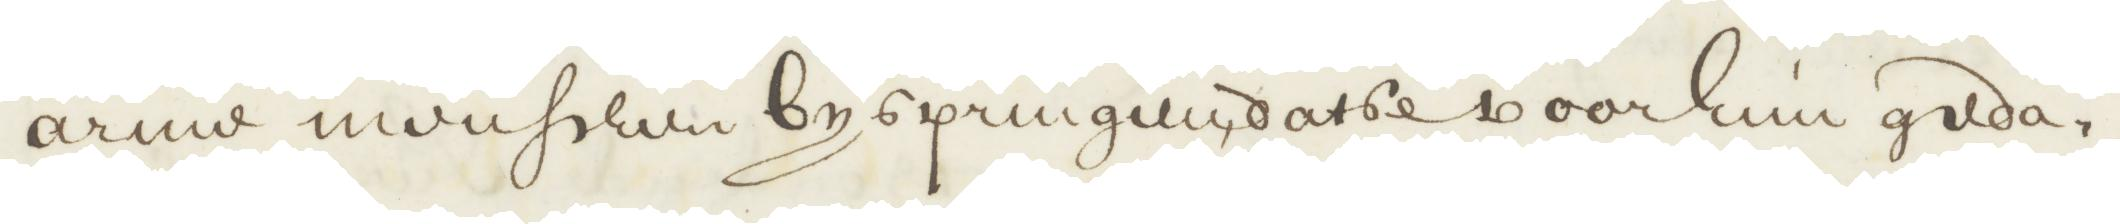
arme menschen bij springen, datse voor hun geda„
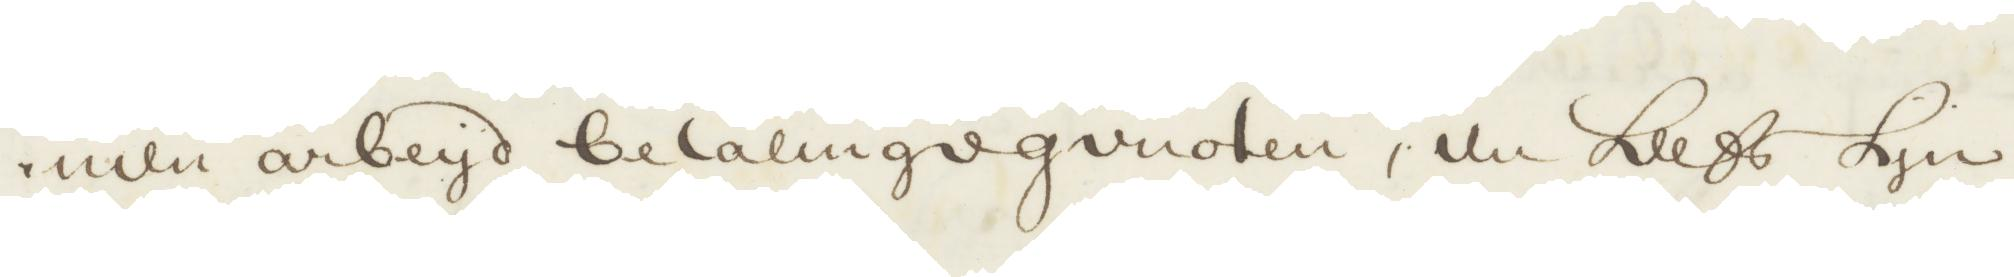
nen arbeijd betalinge genoten, en selfs syn
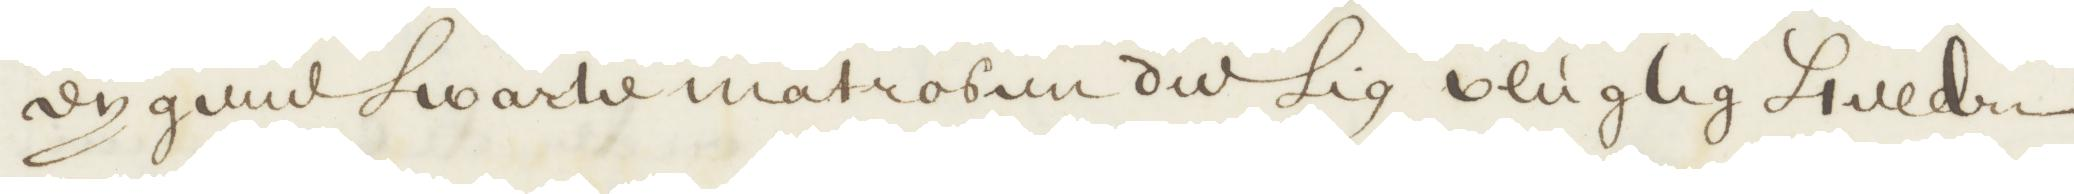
eijgene swarte matrosen die sig vlugtig stelden
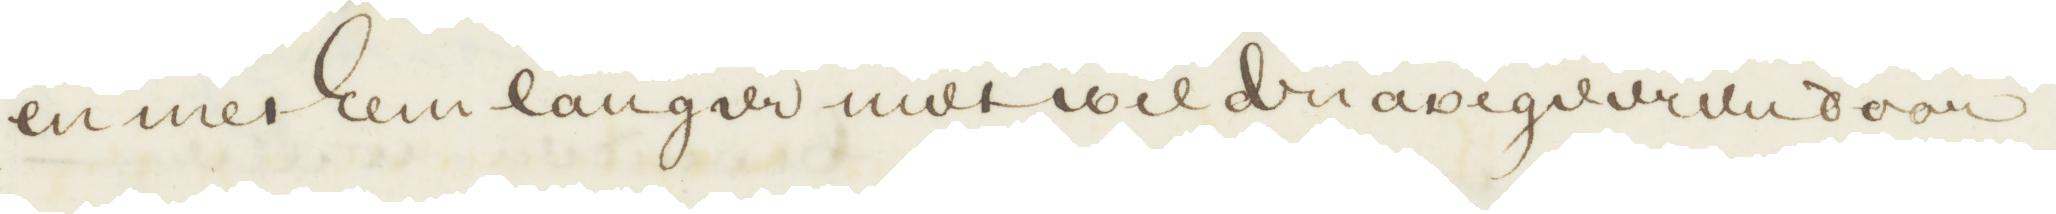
en met hem langer niet wil de navigeeren door
